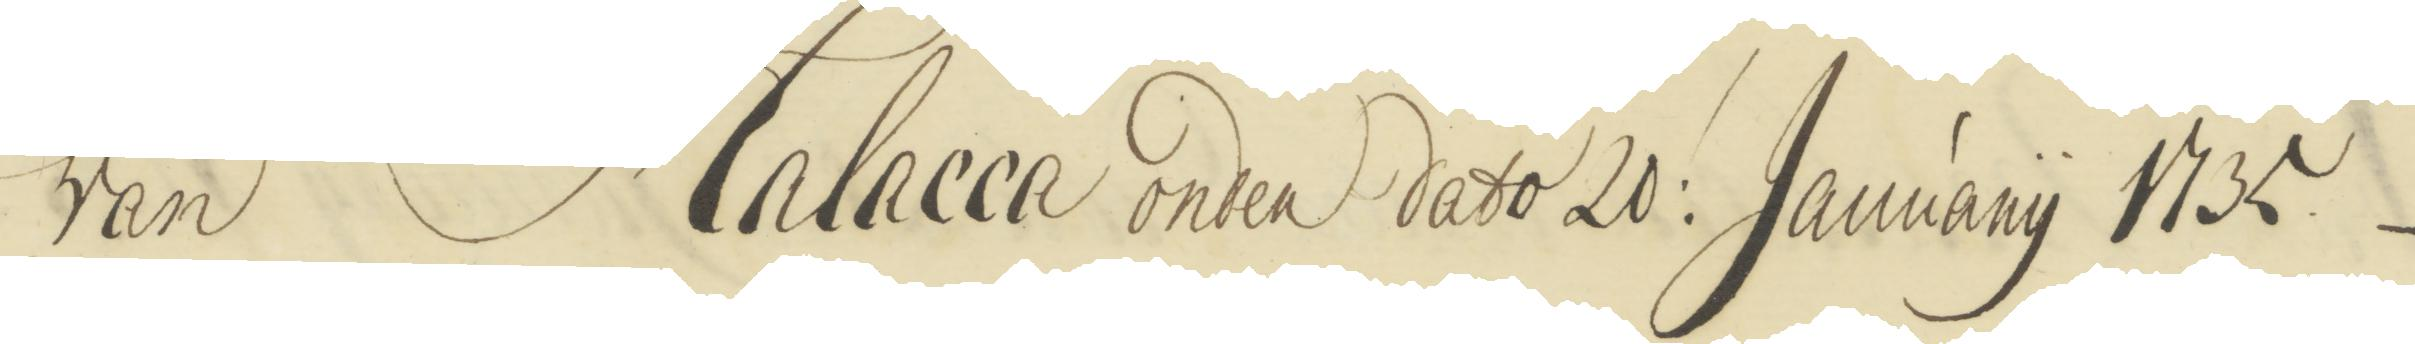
Van Malacca onder dato 20:' Januarij 1735 _
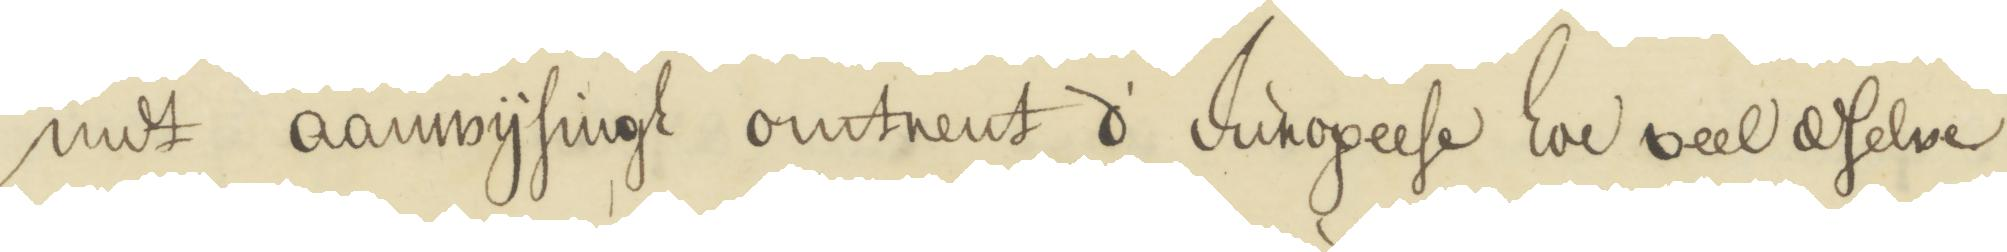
met aanwijsingh omtrent d’ Europeese hoe veel deselve
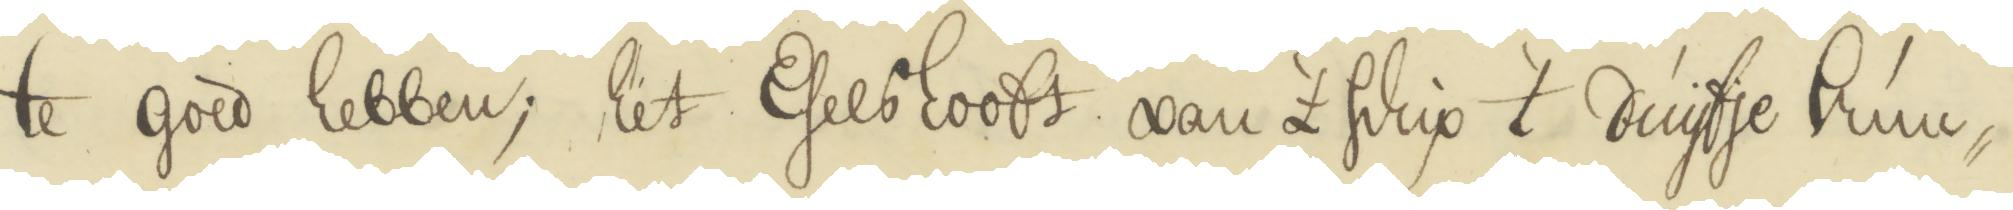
te goed hebben; het Eselshooft van ’t schip ’t duijfje kun„
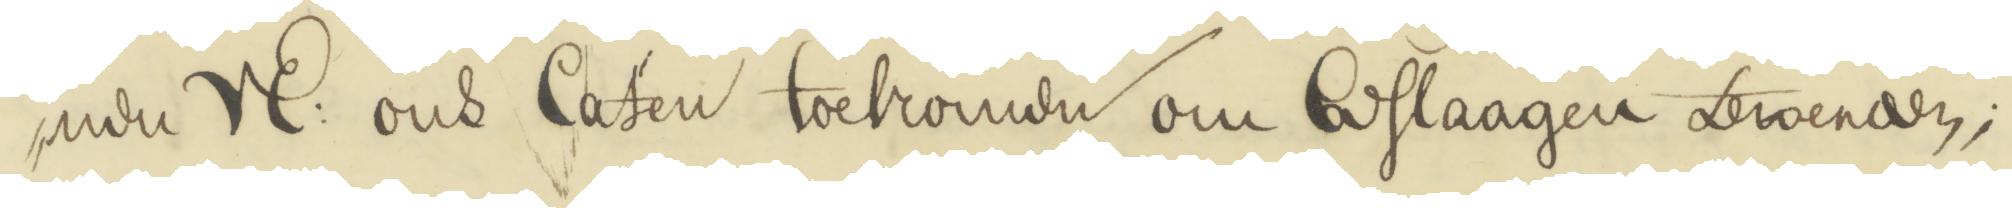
nen VE: ons laten toekomen om beslaagen tewerden;
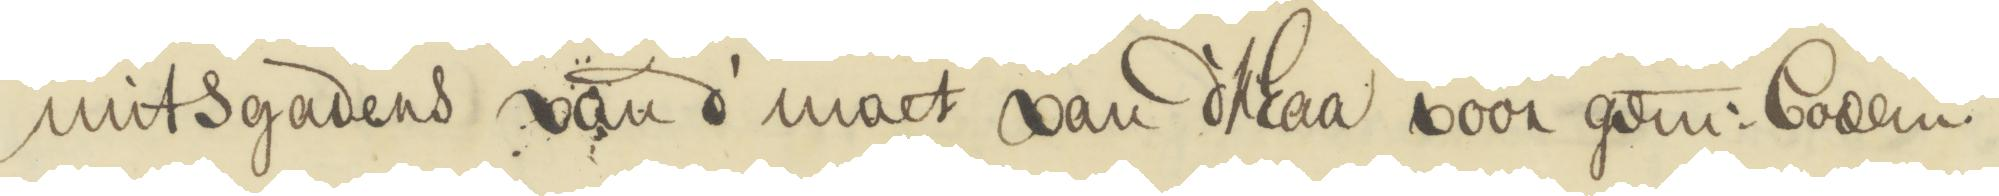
mitsgaders van d’ maet van d'rhaa voor gem: bodem
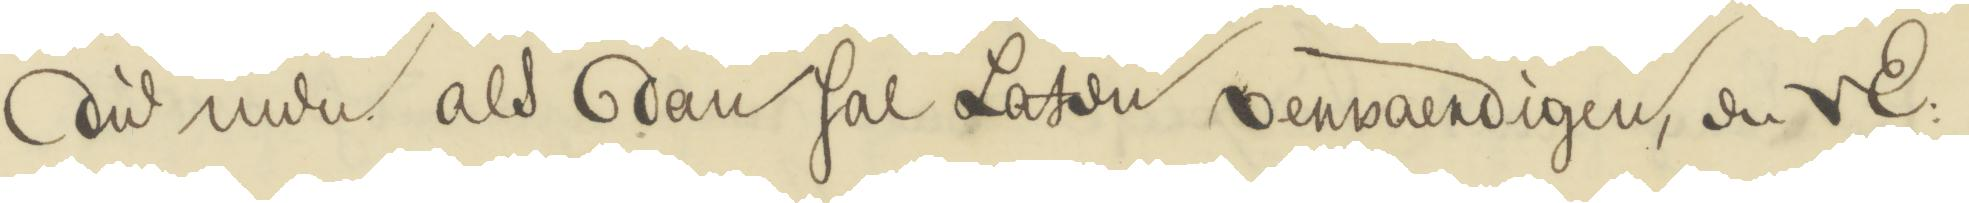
die men als dan sal laten vervaerdigen, en VE:
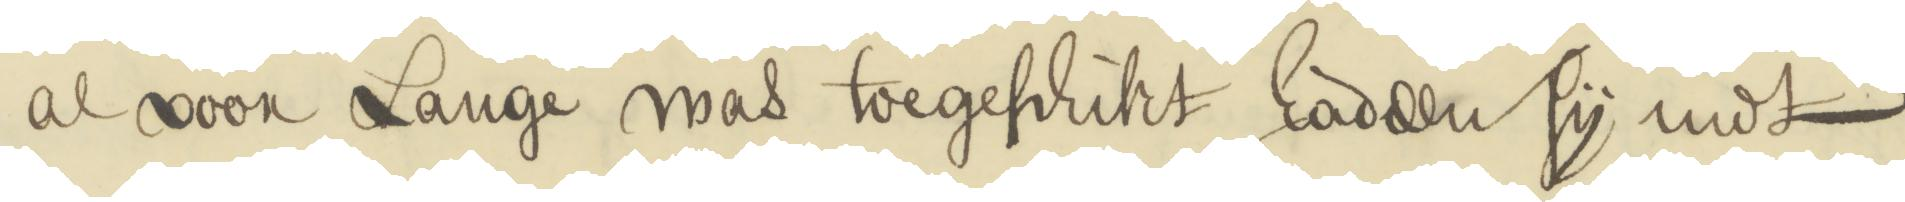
al voor lange was toegeschikt hadden sij niet
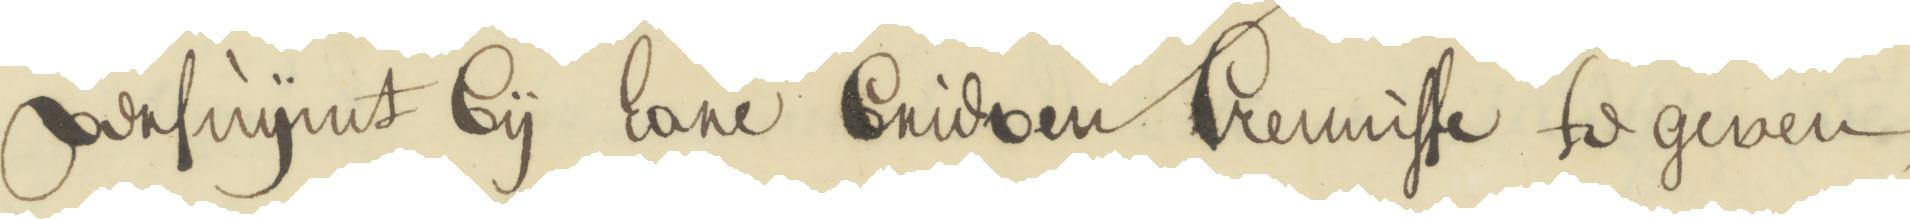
versuijmt bij hare brieven kennisse te geven,
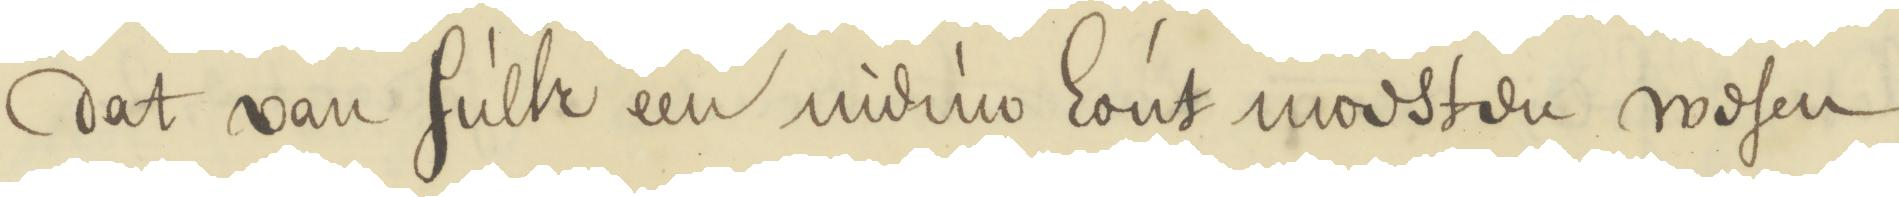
dat van sulk een nieuw hout moesten wesen
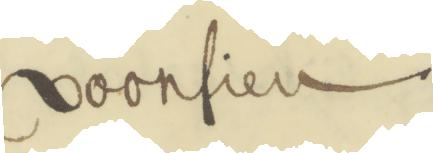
voorsien
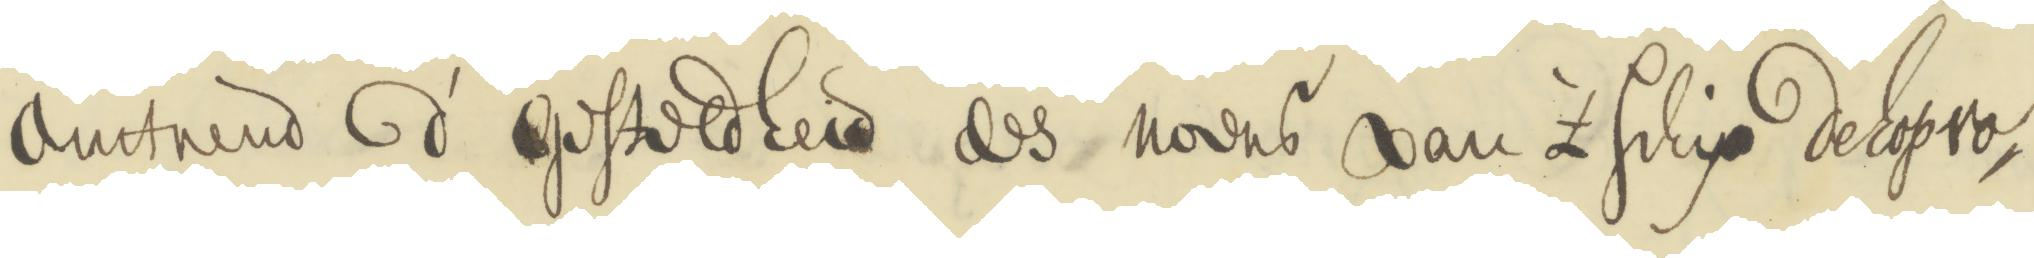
Omtrend d’ gesteldheid des roers van 't schip de hopvo„
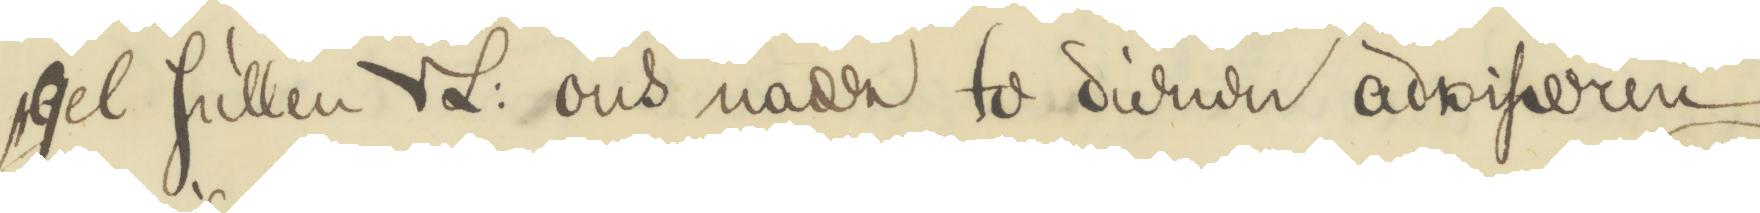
gel sullen VL: ons nader te dienen adviseeren
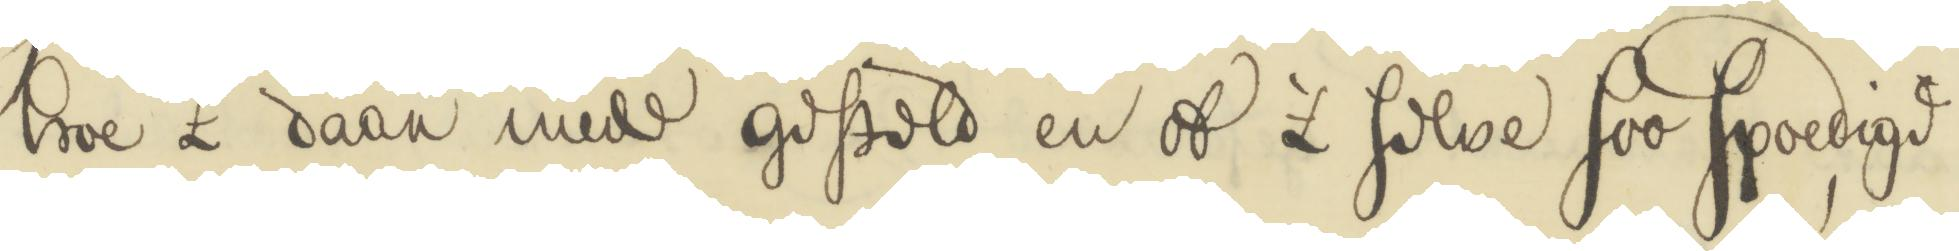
hoe 't daar mede gesteld en of 't selve soo spoedige
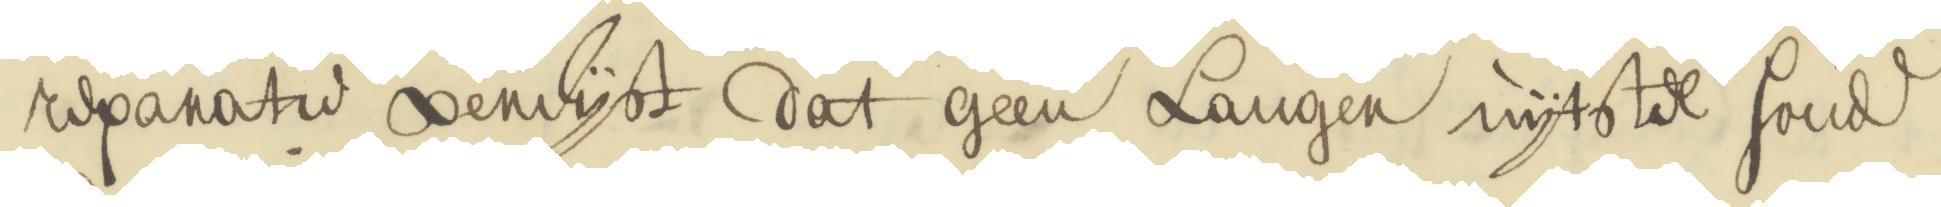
reparatie vereijst dat geen langer uijtstel soude
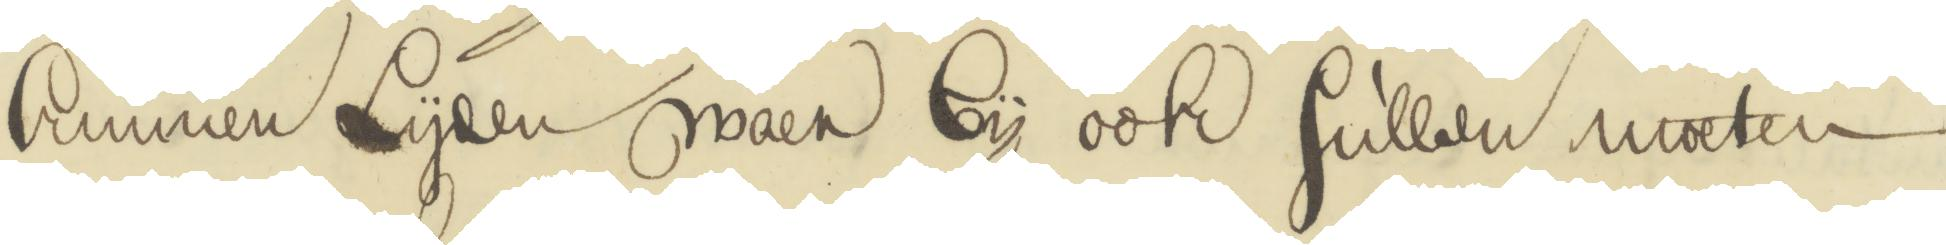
kunnen lijden waer bij ook sullen moeten
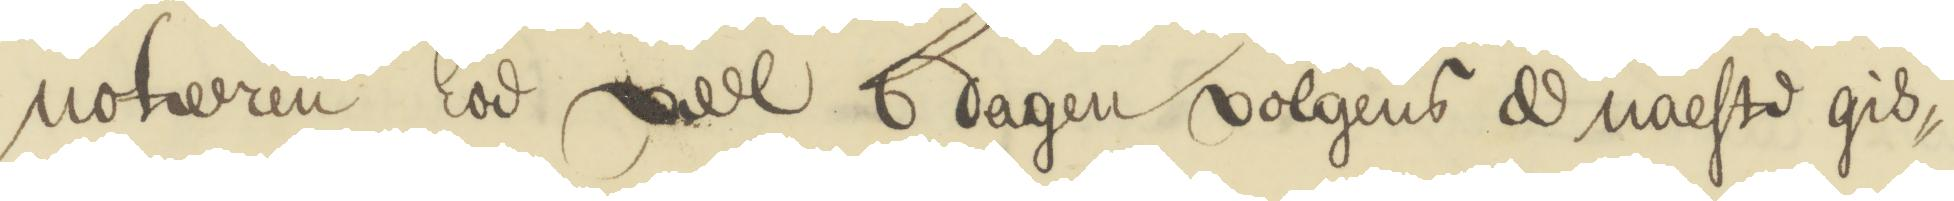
noteeren hoe veel dagen volgens de naeste gis„
